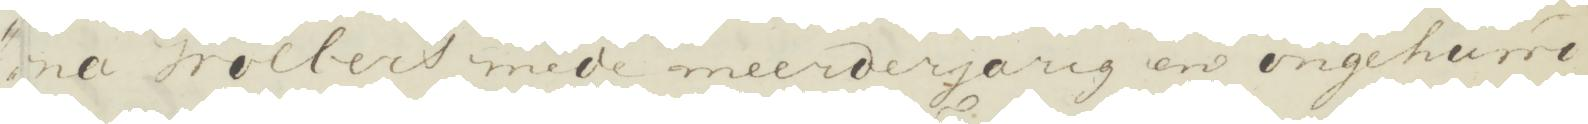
na wolbers mede meerderjarig en ongehuwd
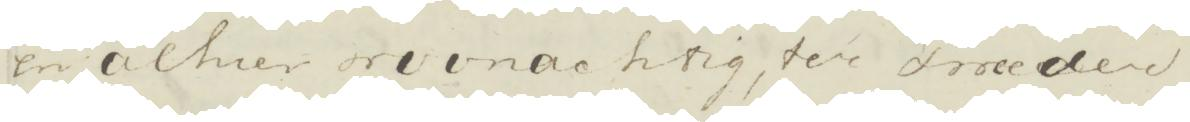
en alhier woonachtig, ter Tweeder
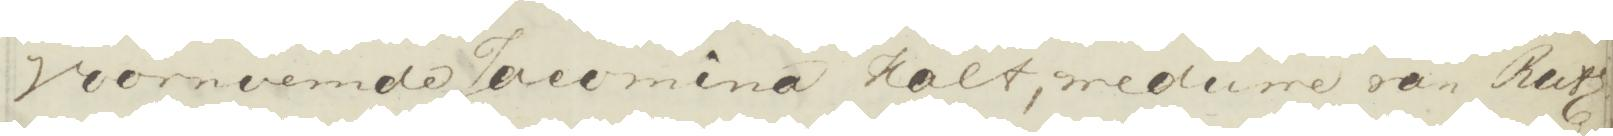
Voornoemde Jacomina Kalt, weduwe van Ruth
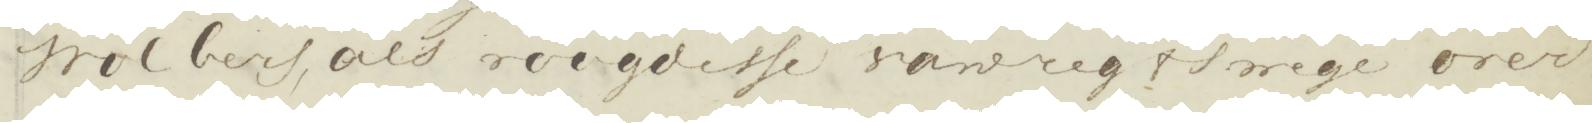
Wolbers, als voogdesse vanregtswege over
